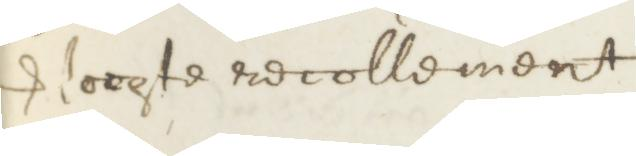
versochte recollement
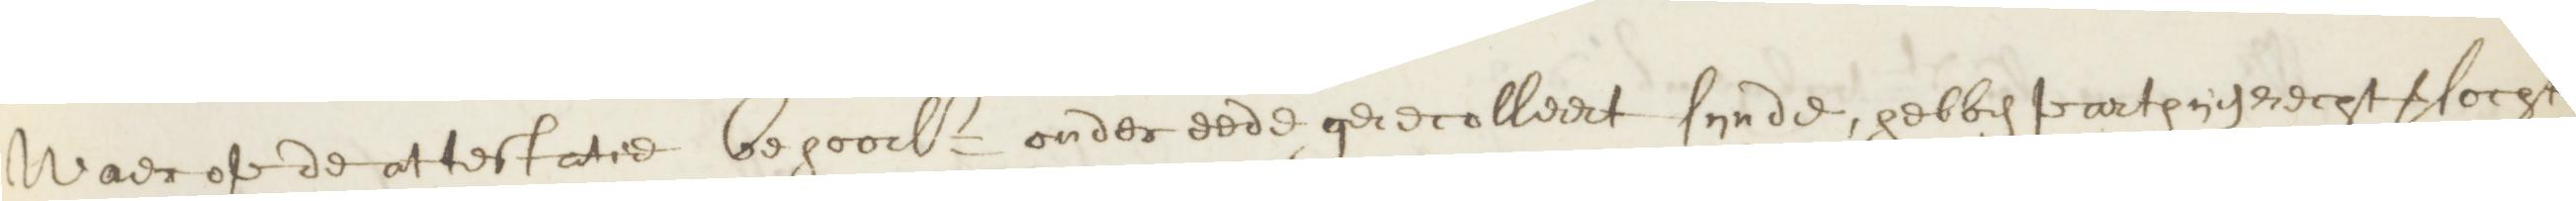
Waerop de attestatie behoorlijk onder eede gerecolleert synde, hebben parthijen recht versocht
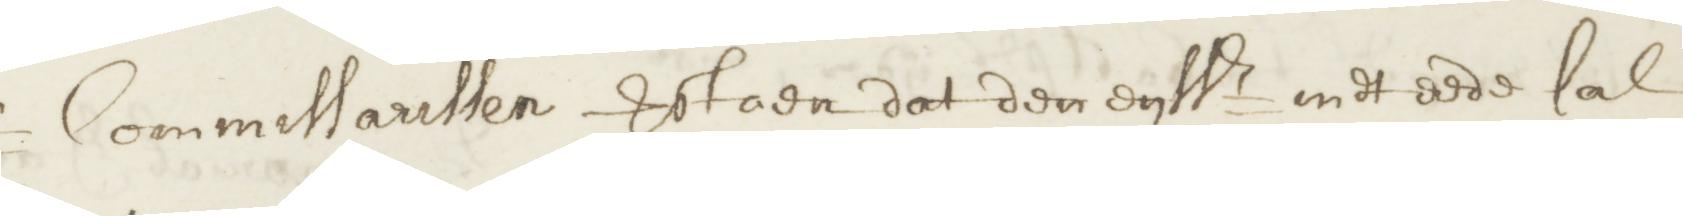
D H=ren Commissarissen verstaen dat den eijss=r met eede sal
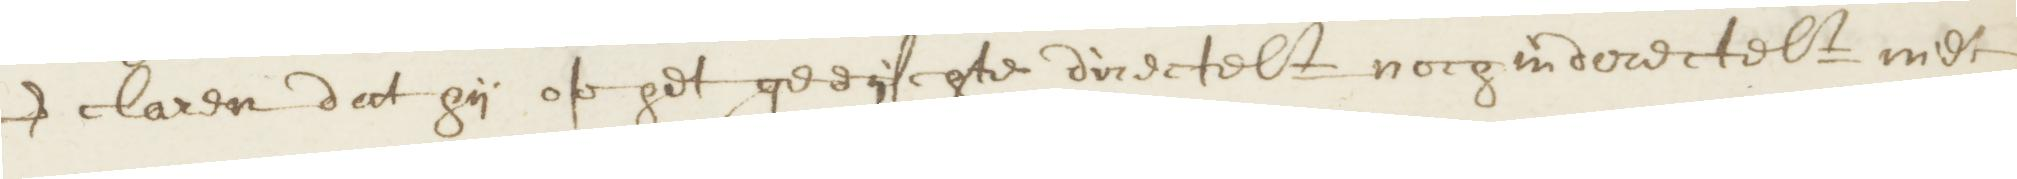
ver claren dat hij op het geeijschte directelijk noch indirectelijk met
